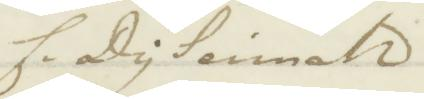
C: Dijserinck
